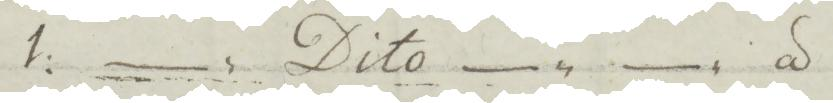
1: —„ Dito —„ —„ a
